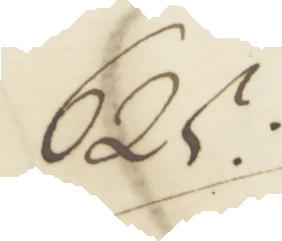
625:
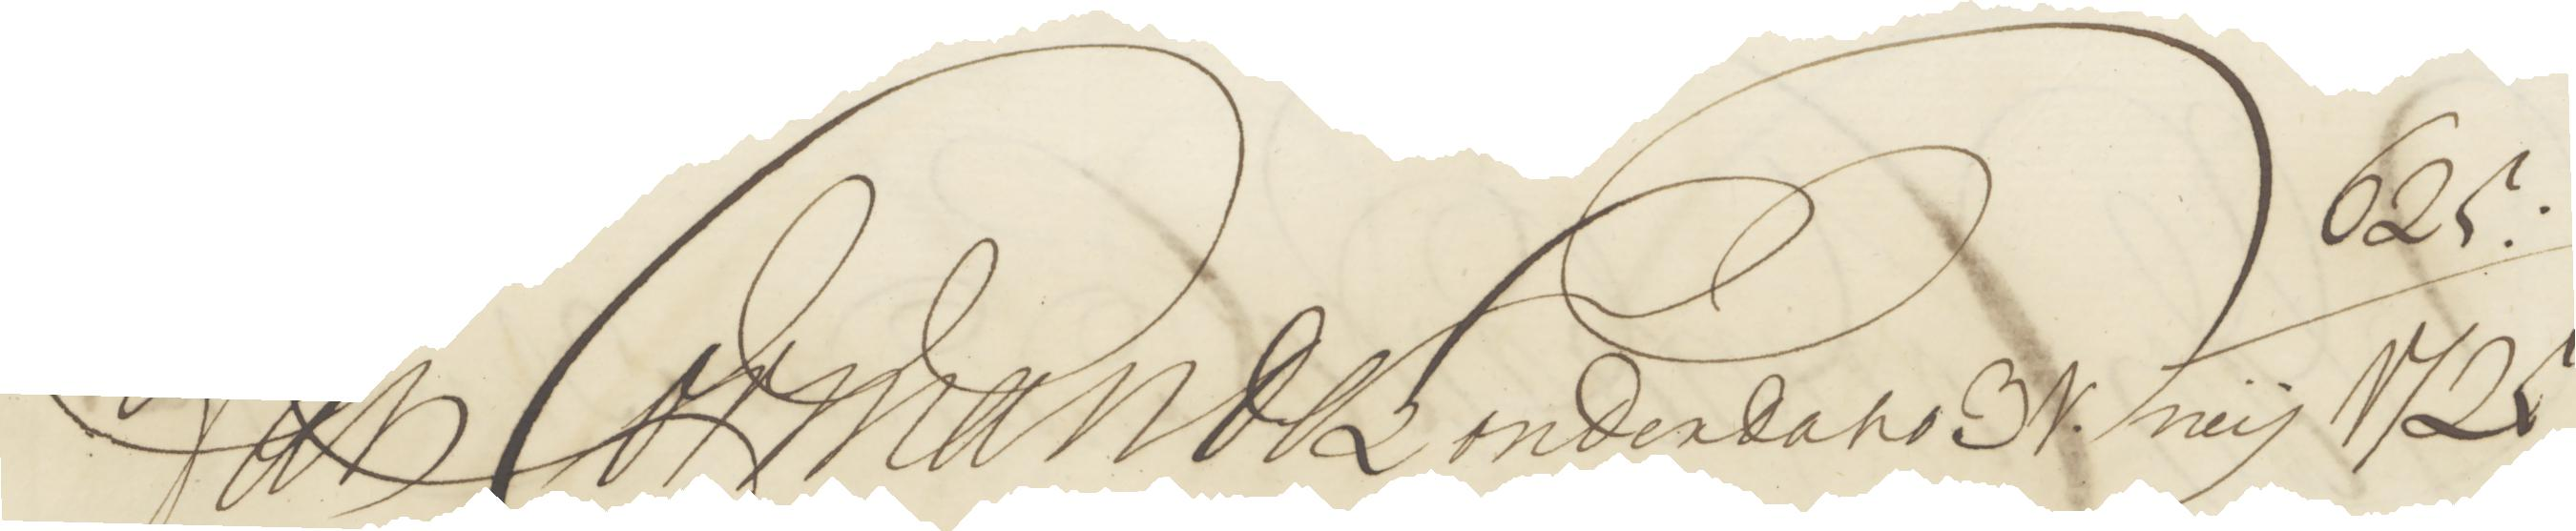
Van Cormandel onder dato 31. meij 1725
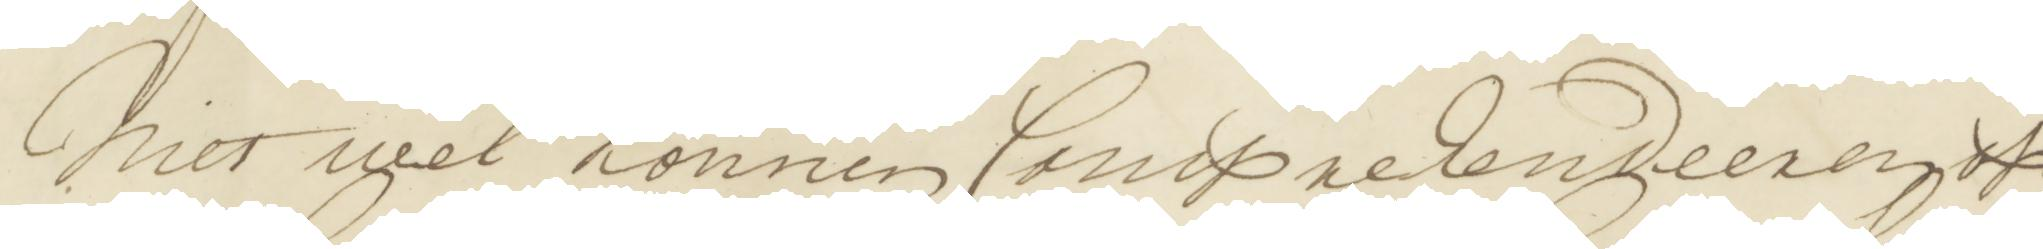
niet wel konnen Comprehendeeren op
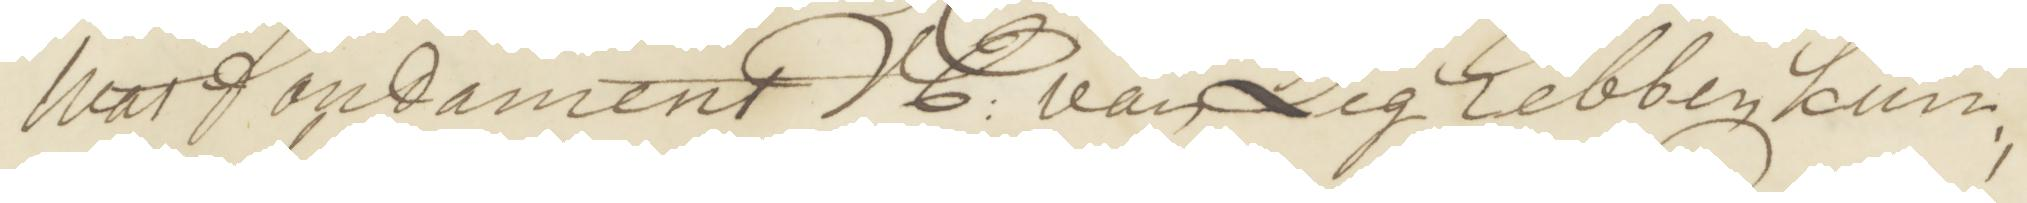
wat fondament VE: van Zig hebben kun„
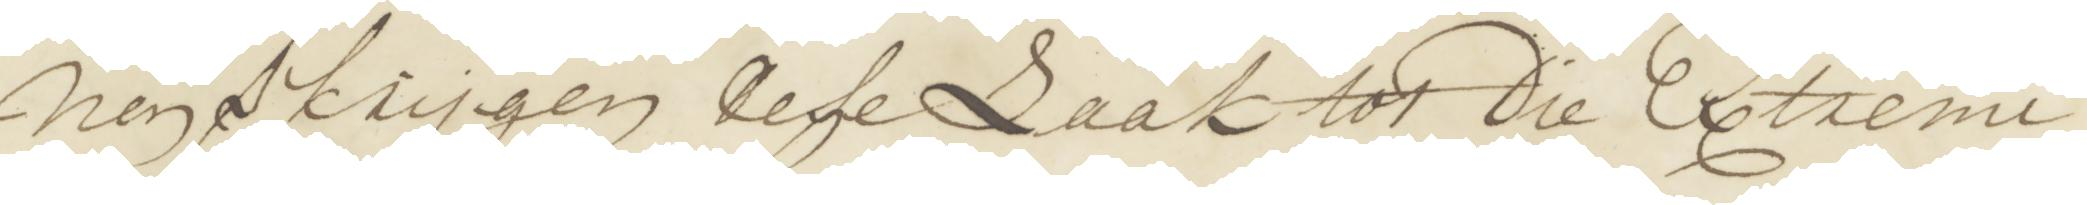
nen verkrijgen dese Zaak tot die Extremi
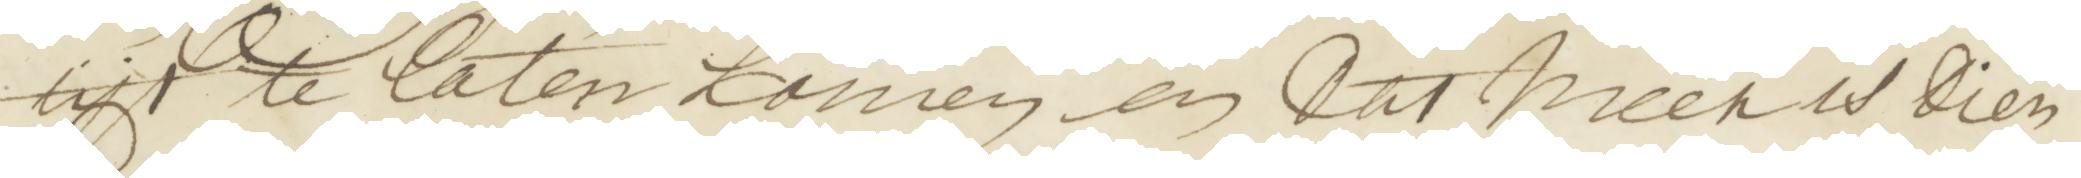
tijt te laten komen en dat meer is dien
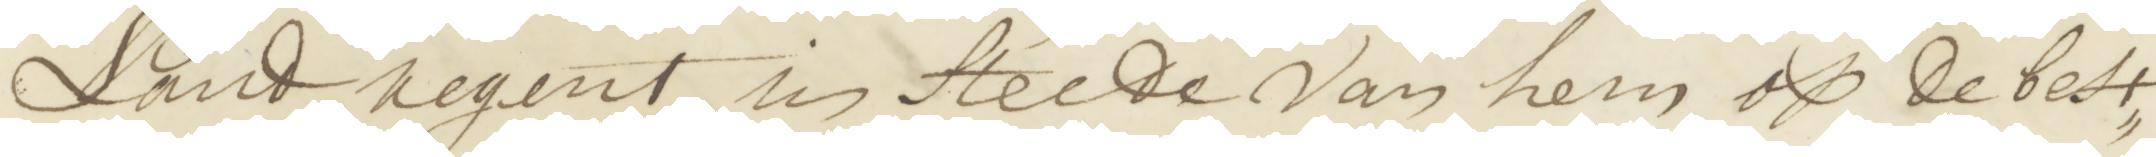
Land regent, in steede van hem op de best„
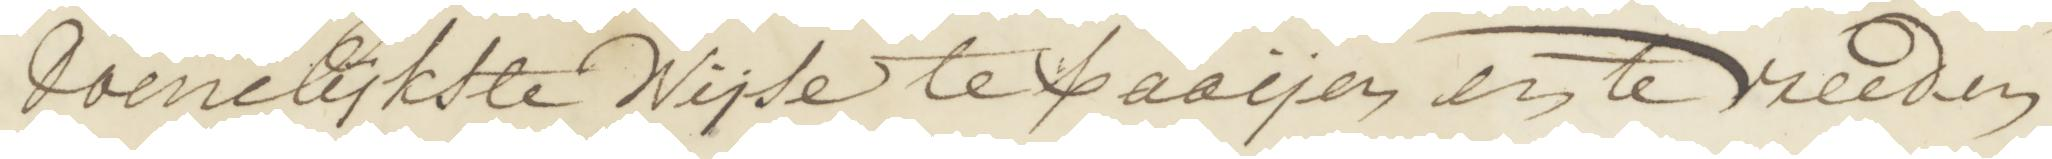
doenelijkste wijse te paaijen en te vreeden
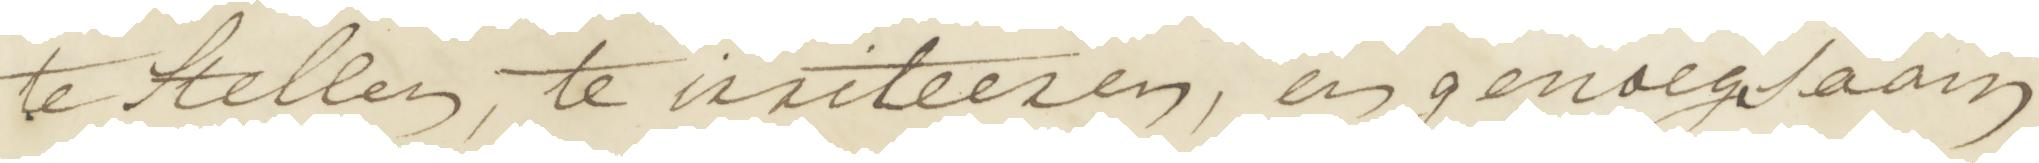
te stellen, te irriteeren, en genoegsaam
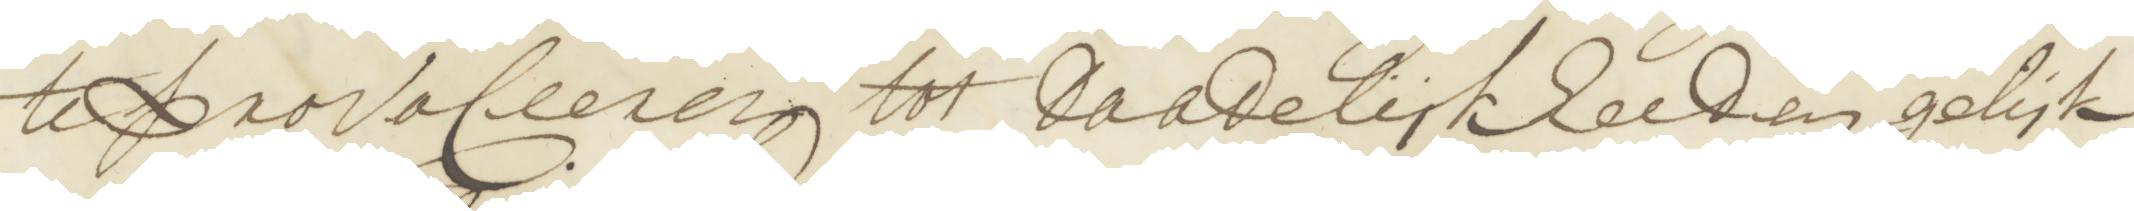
te provoceeren tot daadelijk heeden gelijk
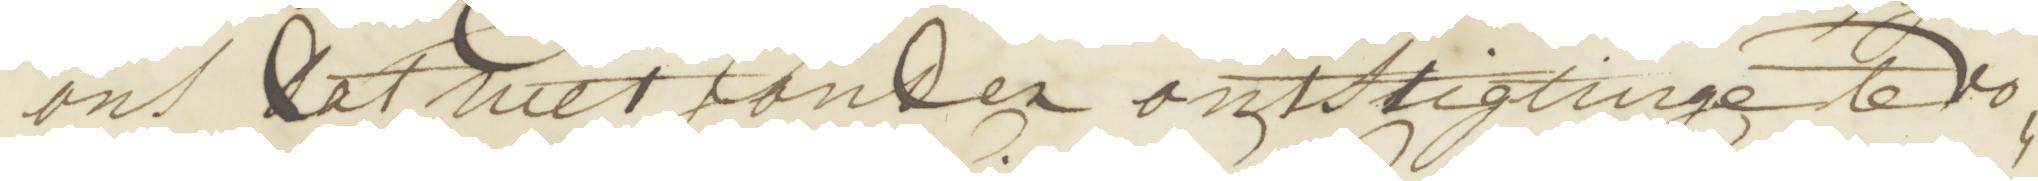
ons dat niet sonder ontstigtinge te vo„
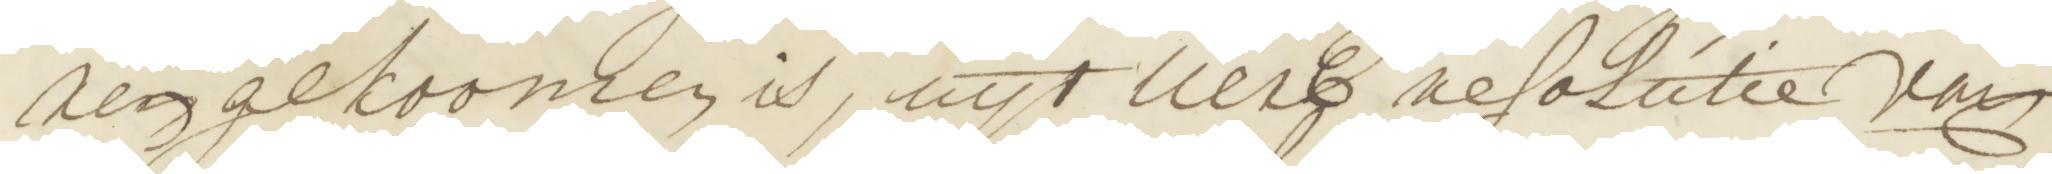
ren gekoomen is, uijt ult E resolutie van
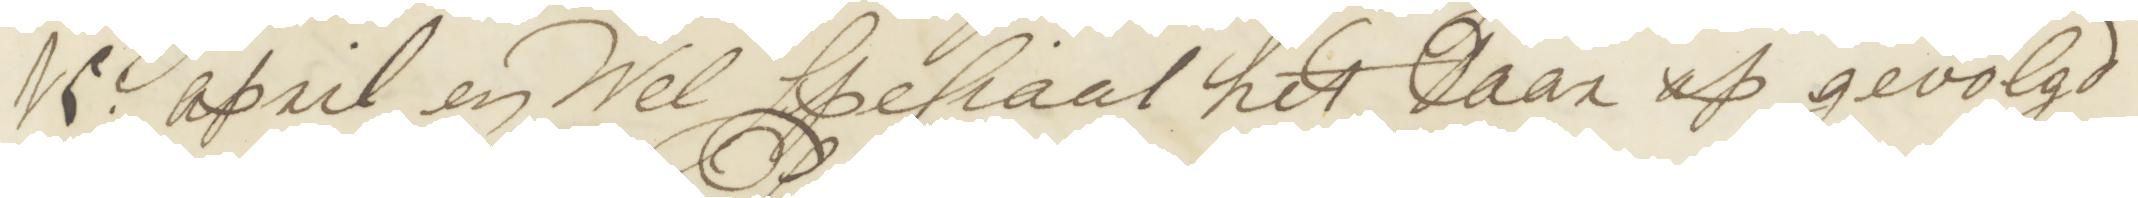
15: april en wel speciaal het daar op gevolgd
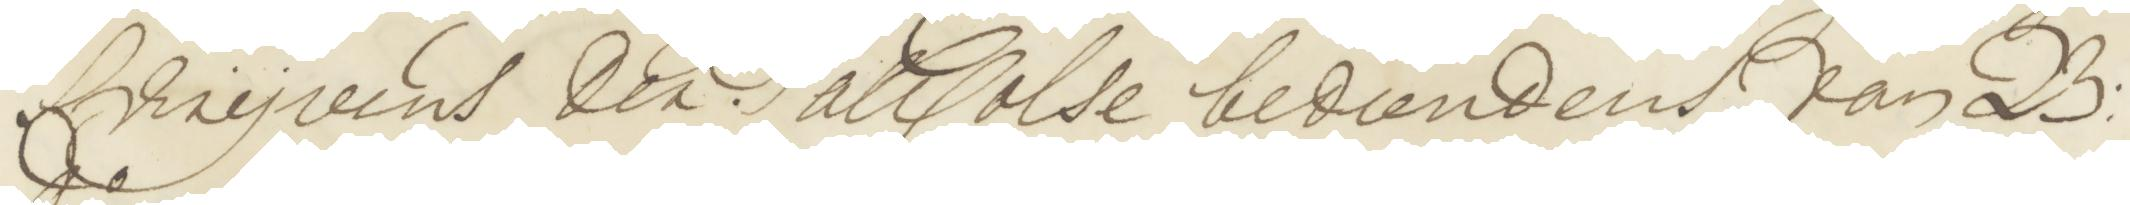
schrijvens der. Palicolse bediendens van 23:
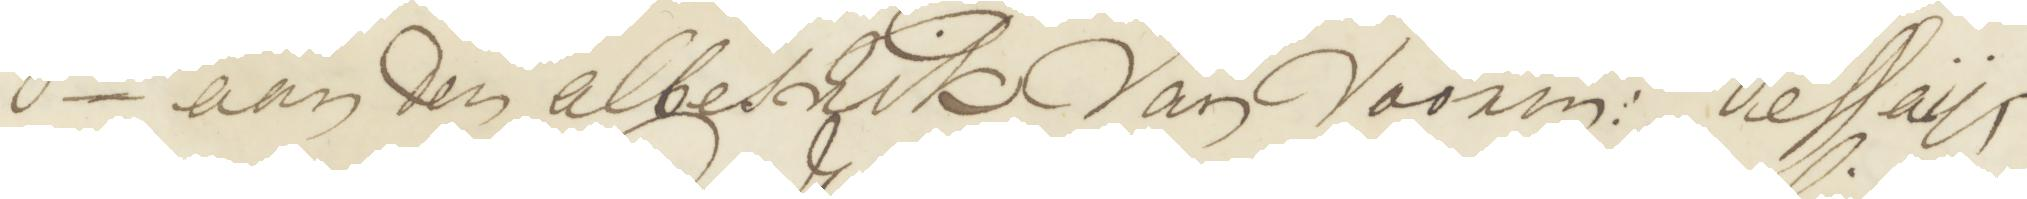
d=o aan den albeschik van Voorm: dessaij,
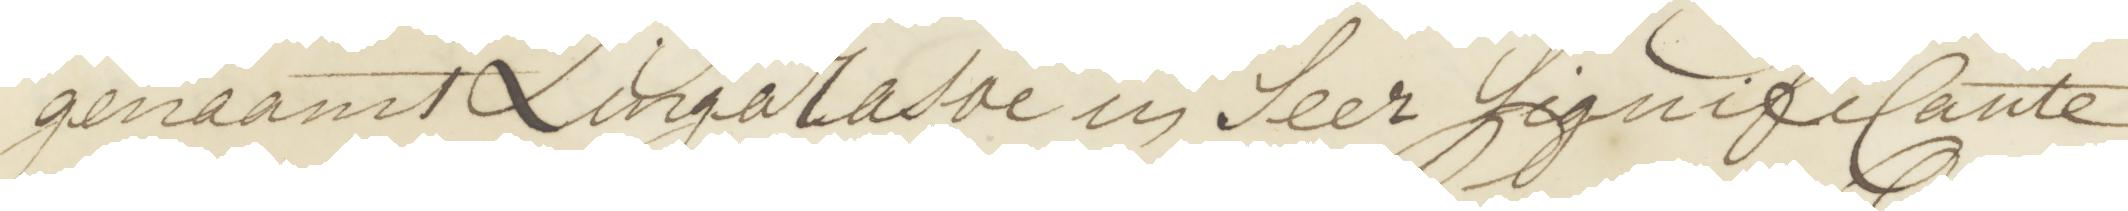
genaamt Lingarasoe in seer significante
